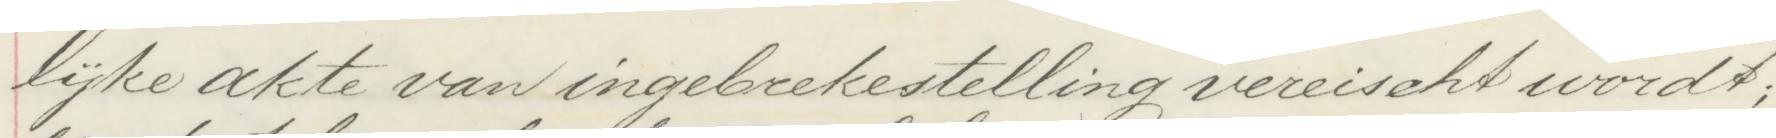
lijke akte van ingebrekestelling vereischt wordt;
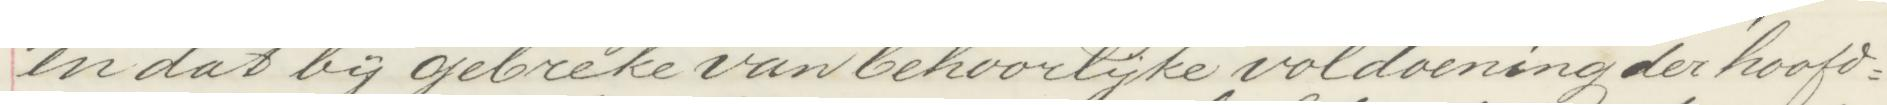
en dat bij gebreke van behoorlijke voldoening der hoofd=
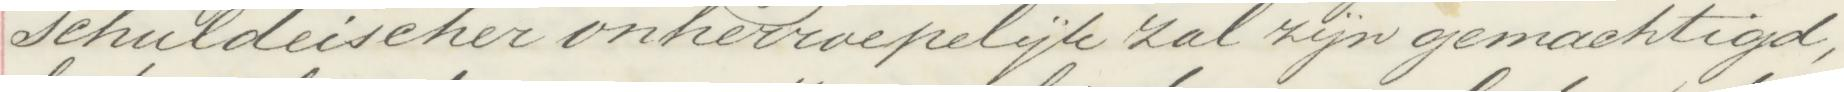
schuldeischer onherroepelijk zal zijn gemachtigd,
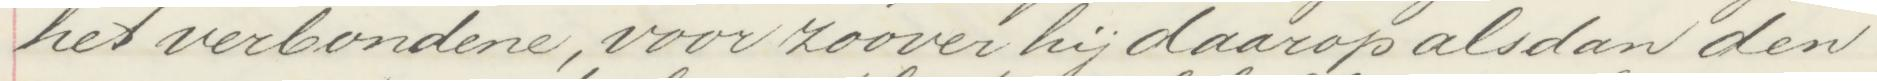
het verbondene, voor zoover hij daarop als dan den
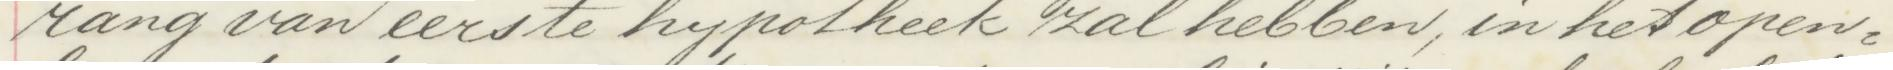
rang van eerste hypotheek zal hebben, in het open=
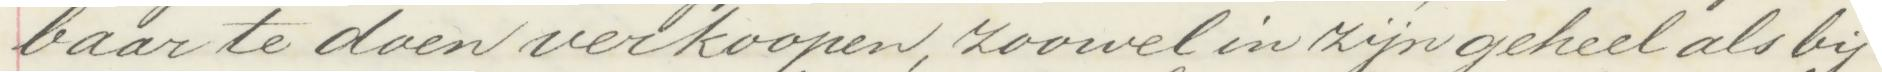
baar te doen verkoopen, zoowel in zijn geheel als bij
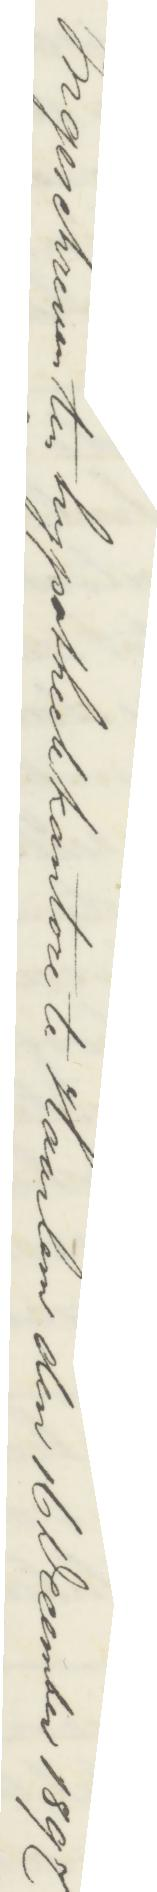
Ingeschreven ten hypotheekkantore te Haarlem den 16 December 1897
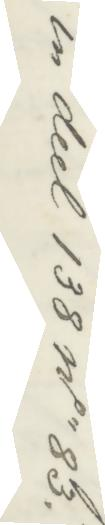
in deel 138 no" 83.
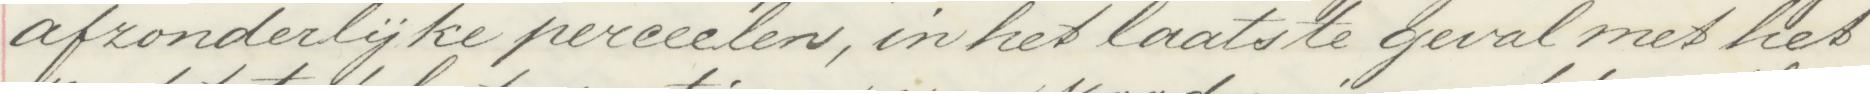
afzonderlijke perceelen, in het laatste geval met het
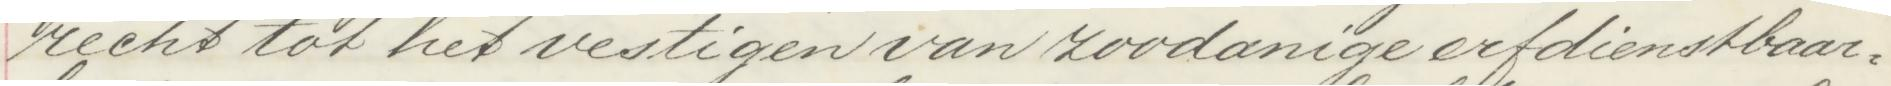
recht tot het vestigen van zoodanige erfdienstbaar=
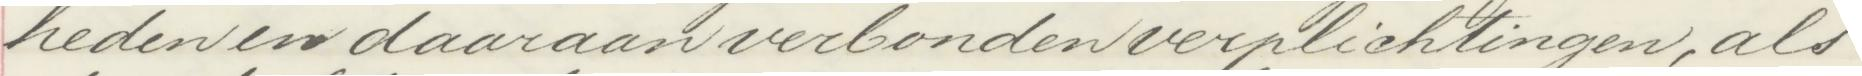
heden en daaraan verbonden verplichtingen, als
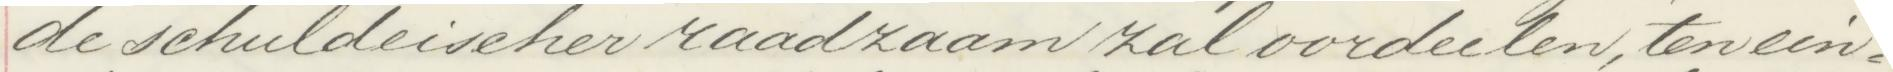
de schuldeischer raadzaam zal oordeelen, ten ein=
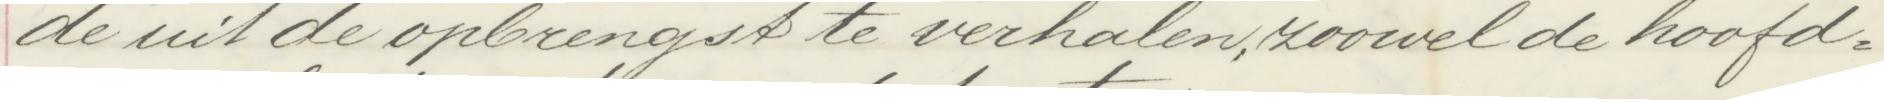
de uit de opbrengst te verhalen, zoowel de hoofd=
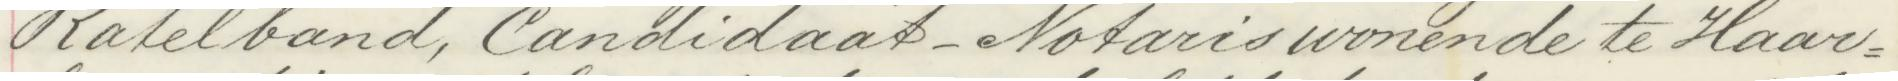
Ratelband, Candidaat - Notaris wonende te Haar=
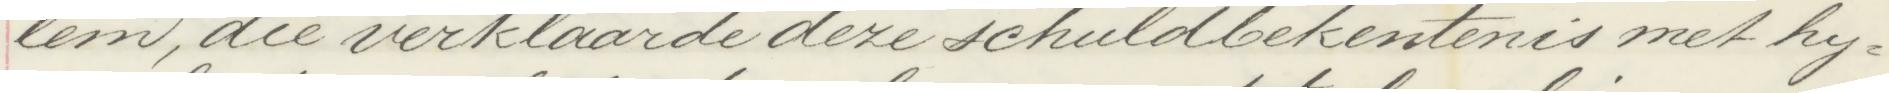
lem, die verklaarde deze schuldbekentenis met hy=
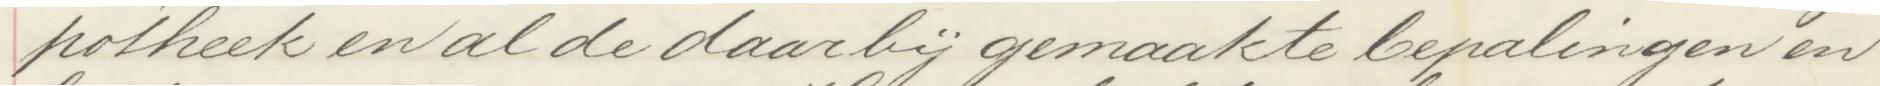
potheek en al de daarbij gemaakte bepalingen en
